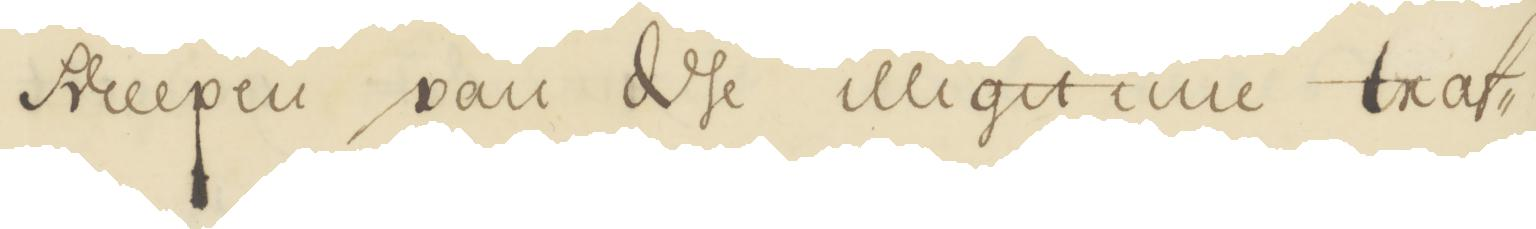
scheepen van dese illigitime traf„
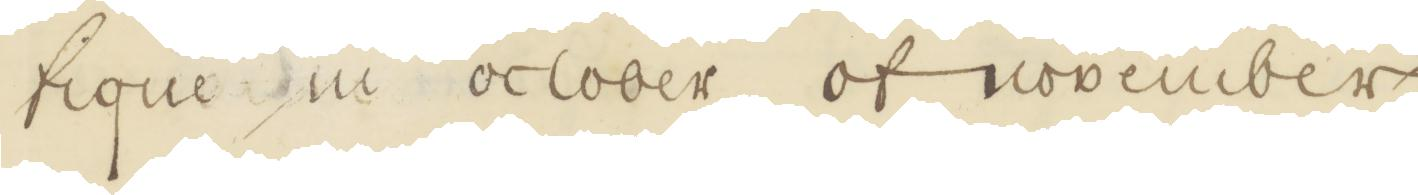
fique in october of november
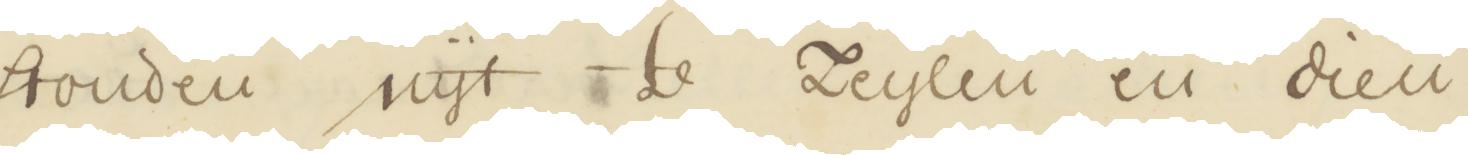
stonden uijt te zeijlen en dien
